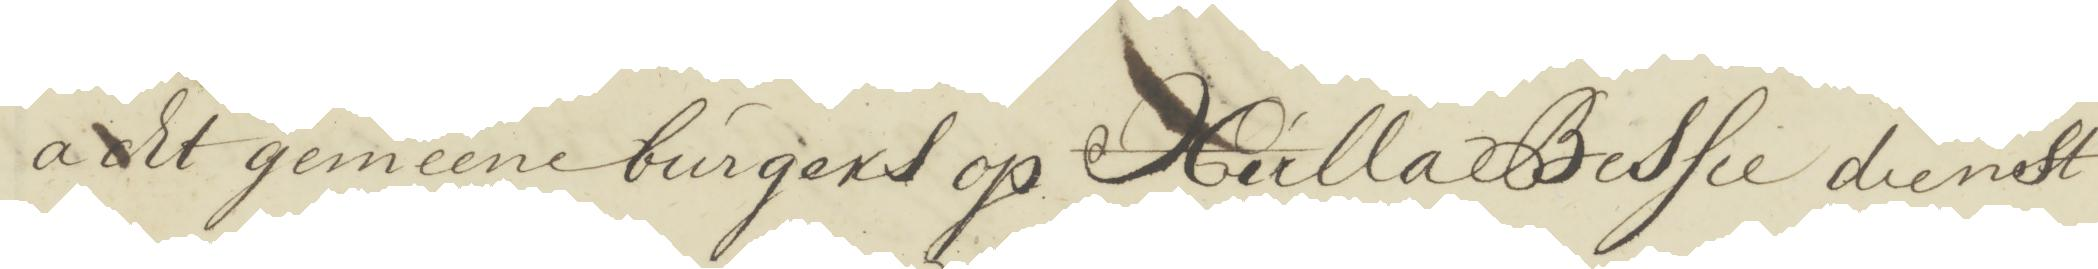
acht gemeene burgers op Xulla Bessie dienst
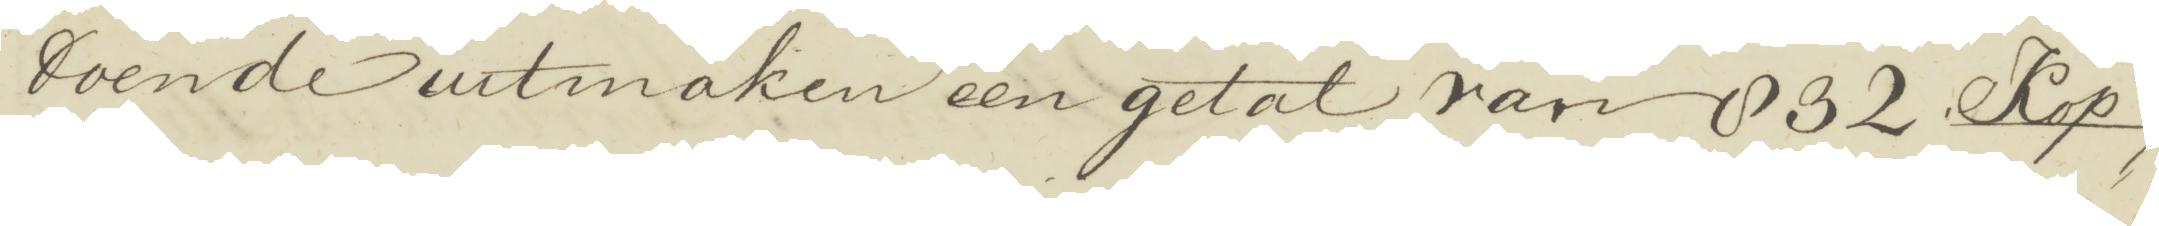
doende uitmaken een getal van 832. Kop„
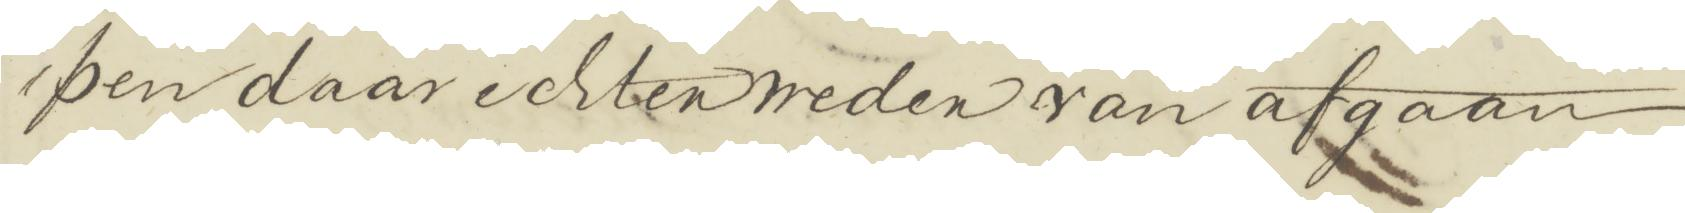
„pen daar echter weder van afgaan
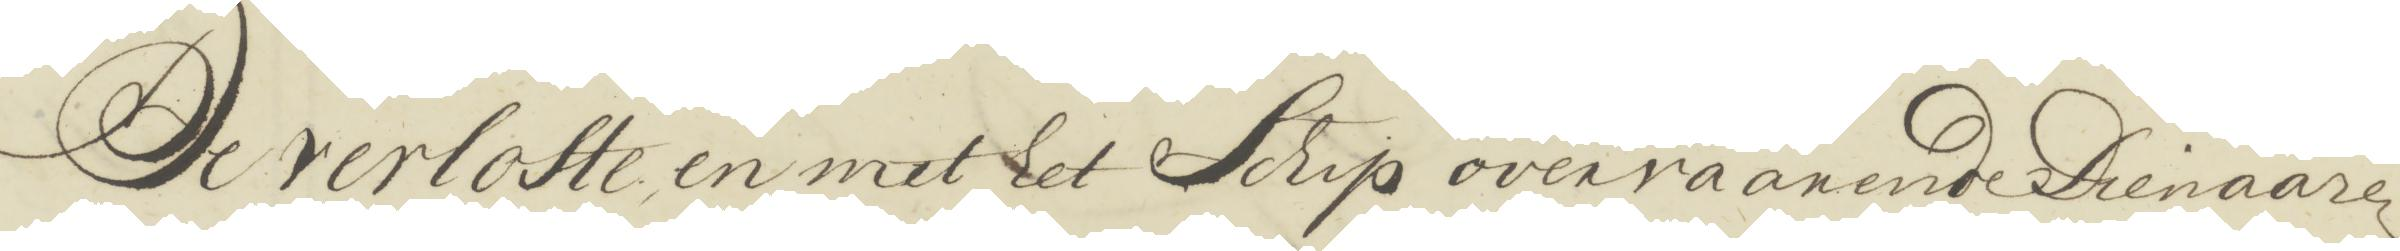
De verloste, en met het schip overvaarende Dienaaren
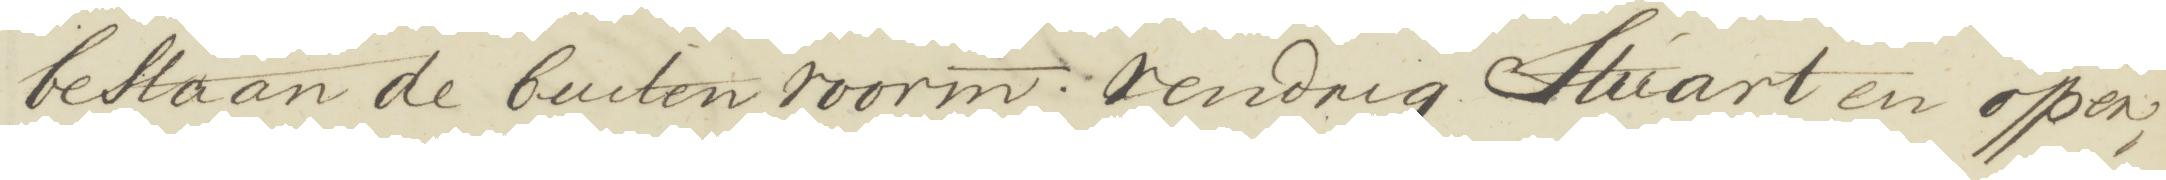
bestaan de buiten voorm. vendrig Stuart en opper„
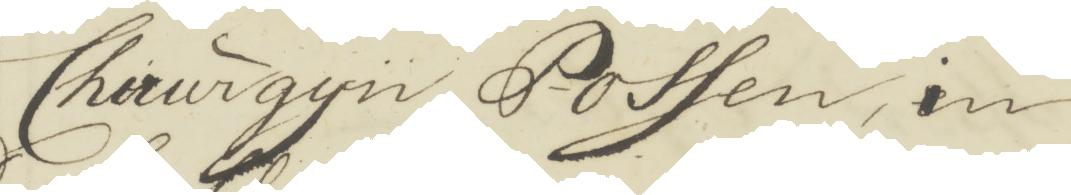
Chirurgijn Possen, in
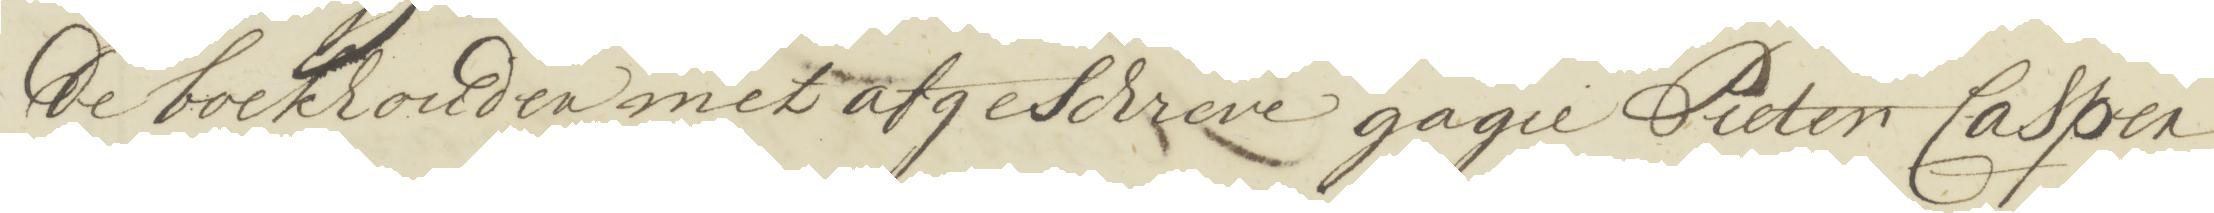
de boekhouder met afgeschreve gagie Pieter Casper
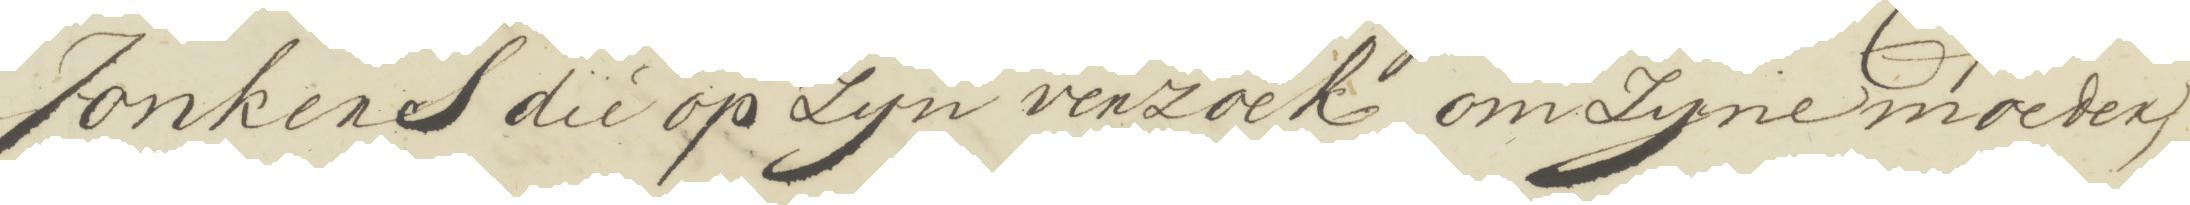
Jonkers die op zijn verzoek om zyne moeder,
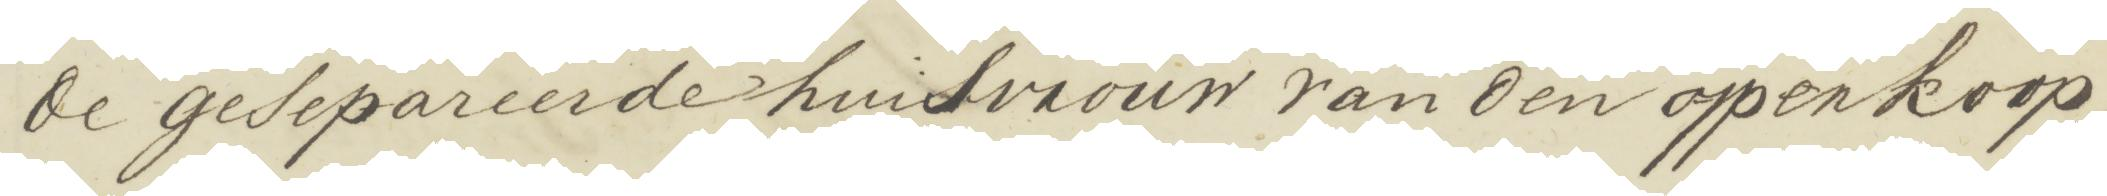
de gesepareerde huisvrouw van den opperkoop
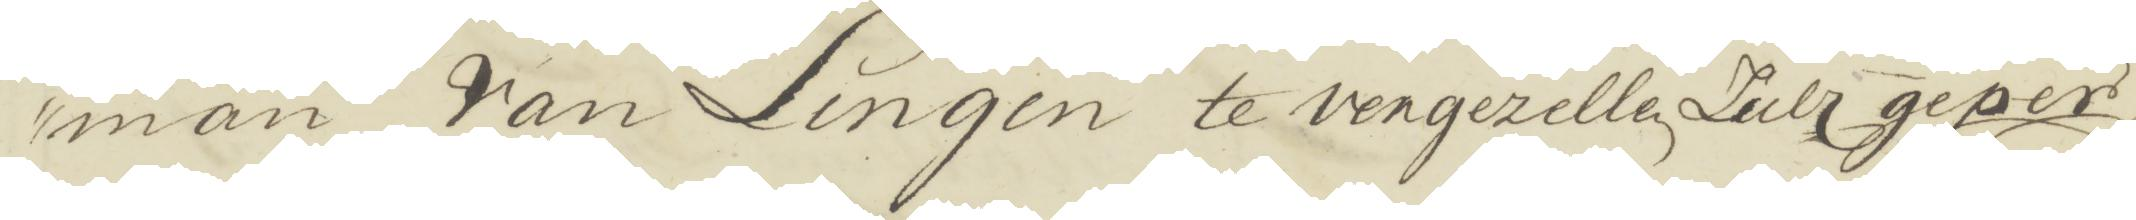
„man van Lingen te vergezellen zulx geper
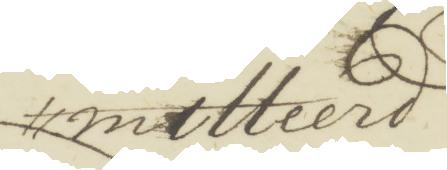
„mitteerd
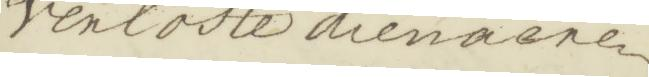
verloste dienaeren
